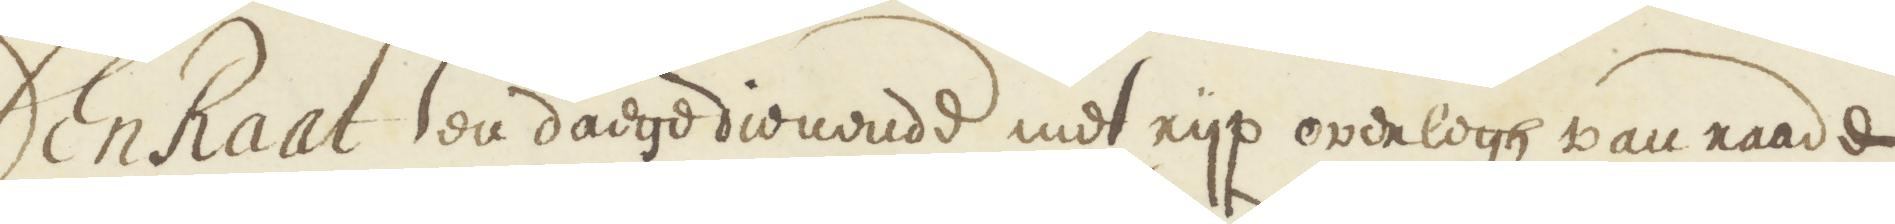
Den Raat ten daege dienende met rijp overlegh van raade
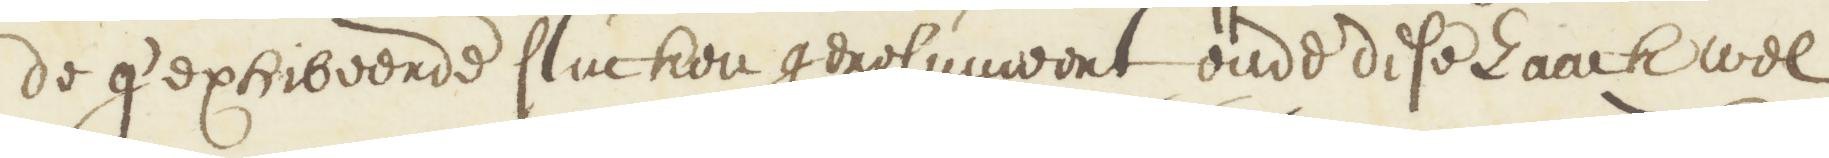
de g’exhibeerde stucken geresumeert ende dese zaack wel
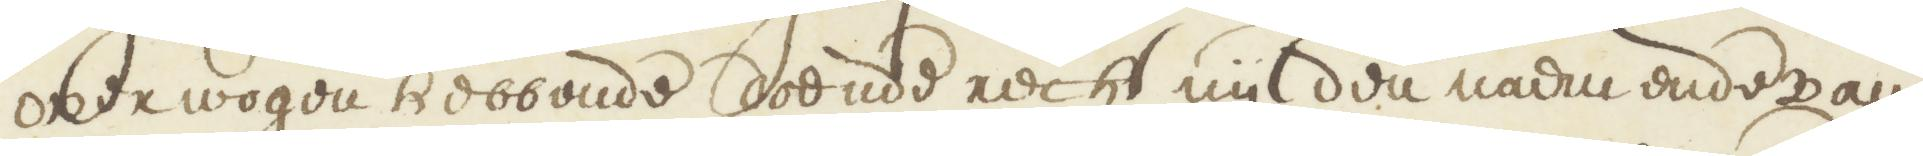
overwogen hebbende doende recht uijt den naem ende van
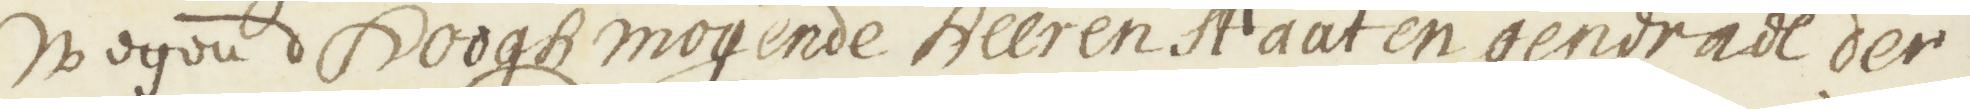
Wegen d Hoogh mogende Heeren staaten generael der
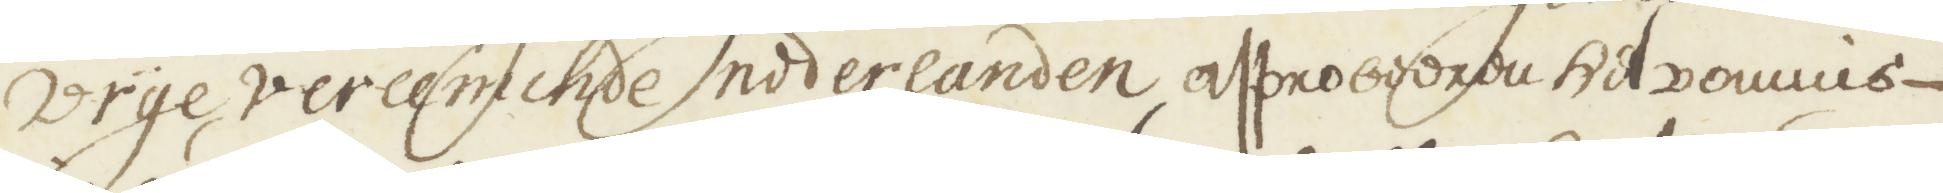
vrije vereenichde nederlanden approbeeren het vannnis —
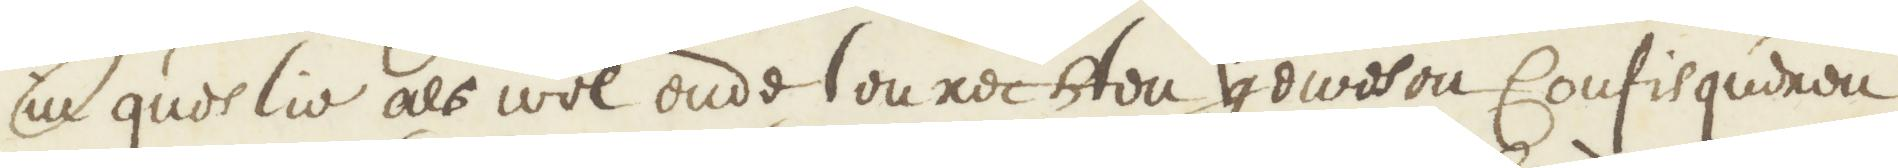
in questie als wel ende ten rechten gewesen Confisqueren
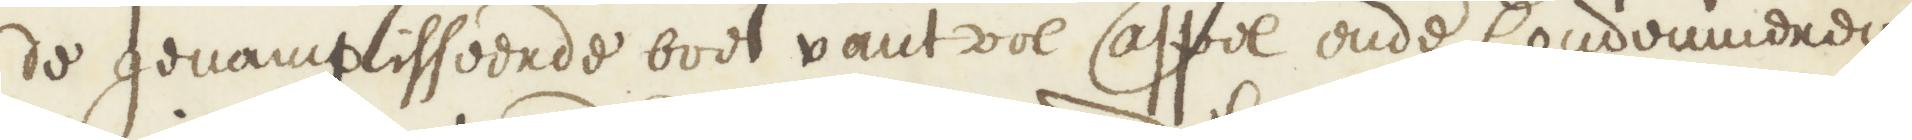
de genamptisseerde boet vant vol appel ende Condemneren
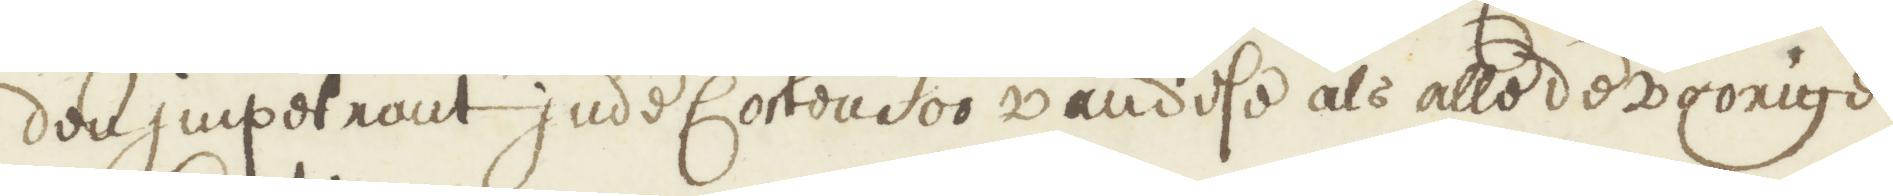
den jmpetrant jnde Costen soo vandese als alle de voorige
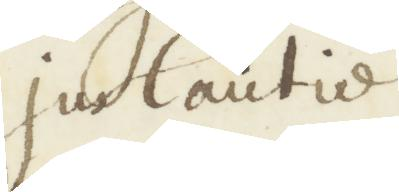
jnstantie
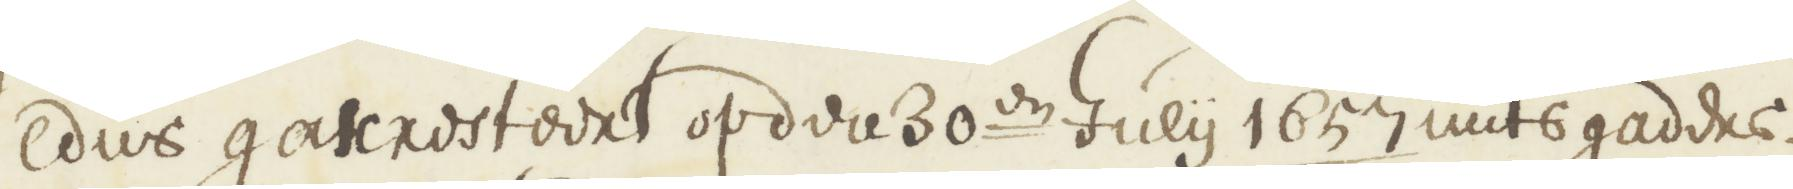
Aldus garresteert opden 30=en Iulij 1657 mitsgaders —
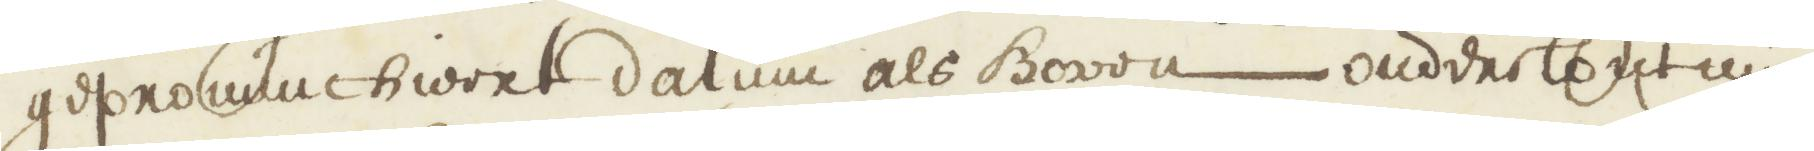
gepronunchieert datum als Boven onderstontmij
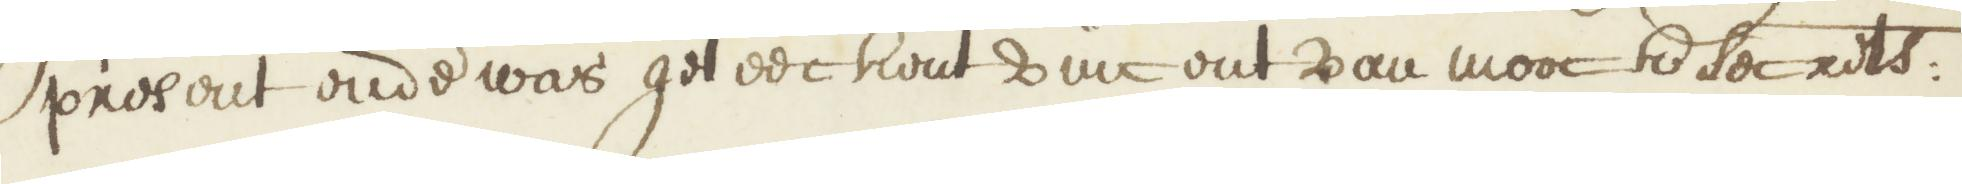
present ende was geteeckent vincent van moock secrets:
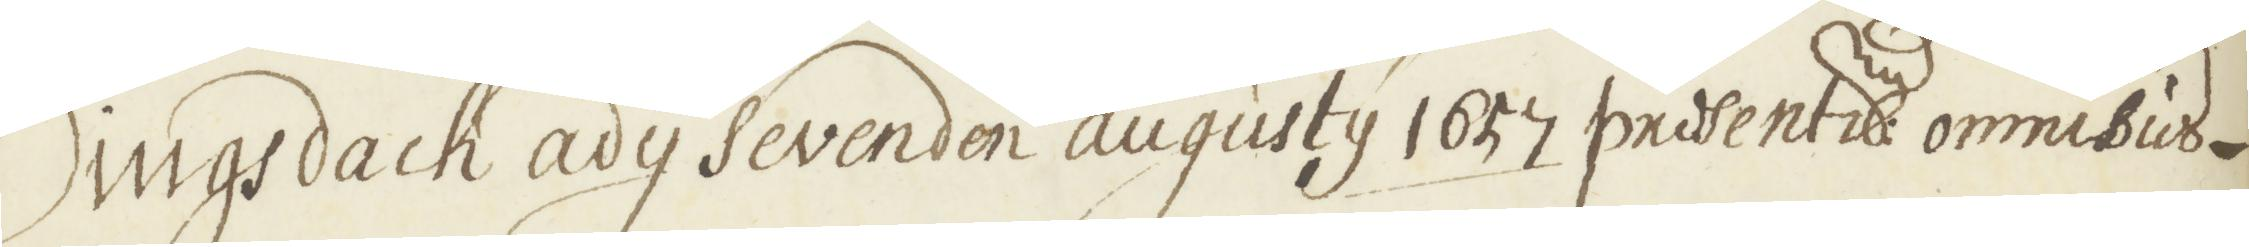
Dingsdach adij sevenden augustij 1657 presentib:s omnibus —
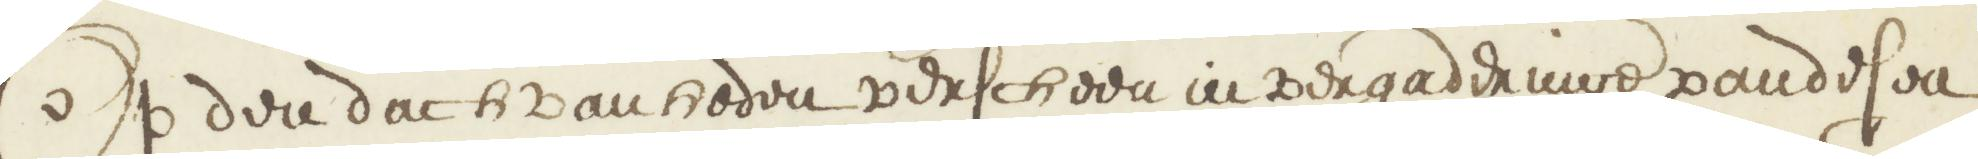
Op den dach van heden verscheen in vergaderinge vandesen
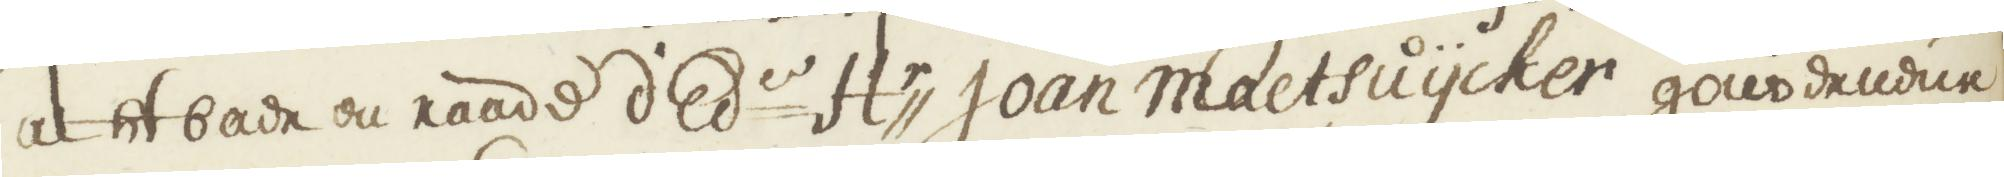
achtbaer en raade d’Ed=e Hrs Joan maetsuijcker gouverneur
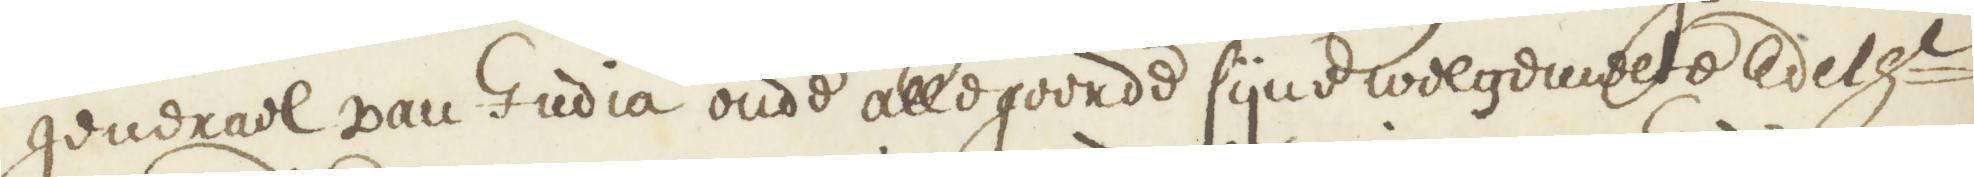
generael van India ende allegeerde sijne welgemelte Edelh=t
